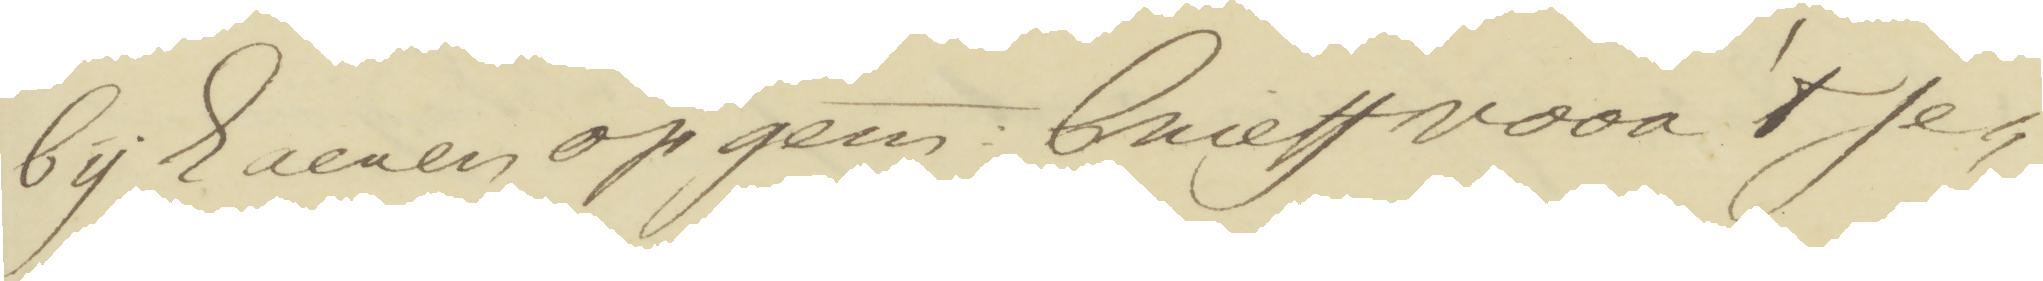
bij haeren op gem: brieff voor ’t je„
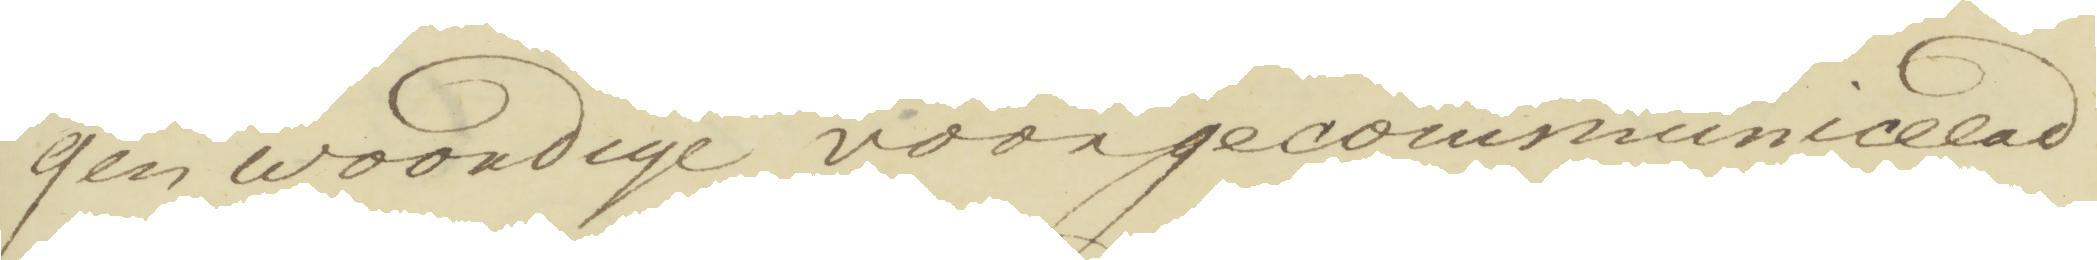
gen woordige voor gecommuniceerd
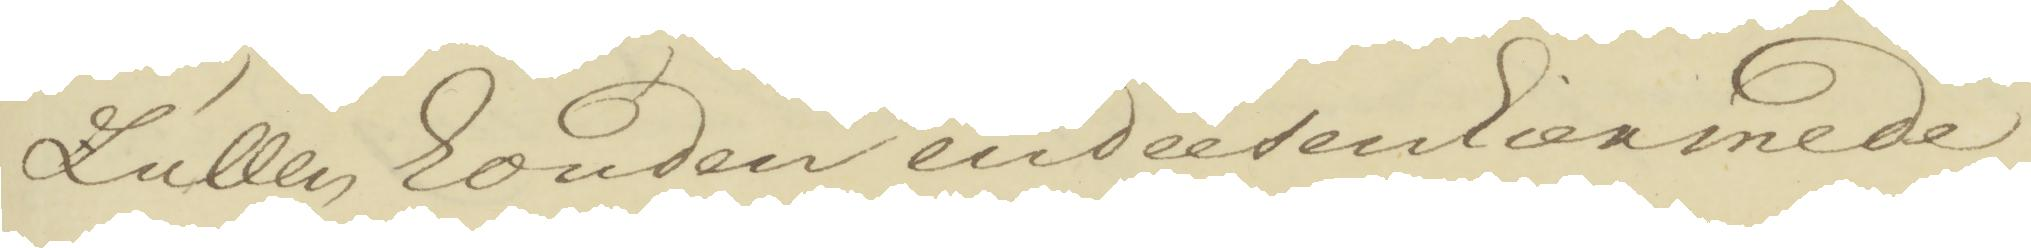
zullen houden en deesen hier mede
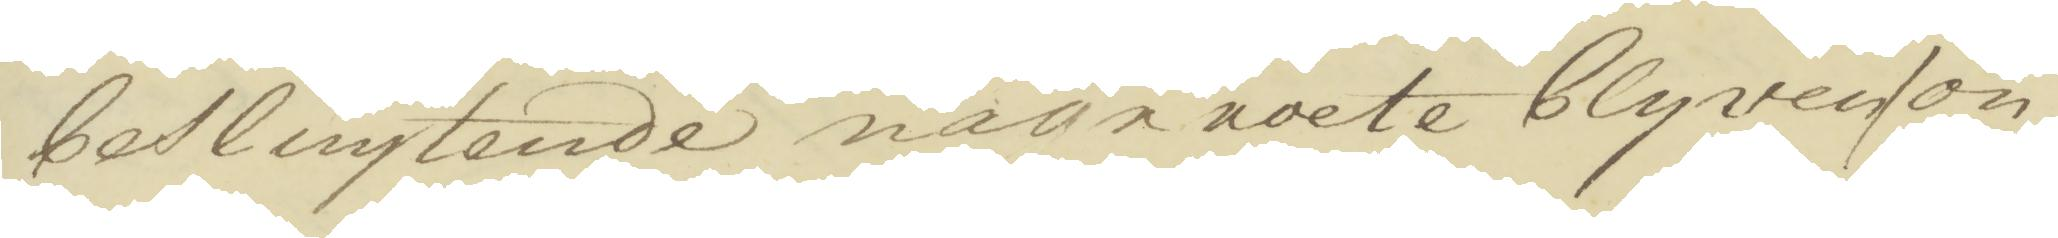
besluijtende nagr roete blyven/on
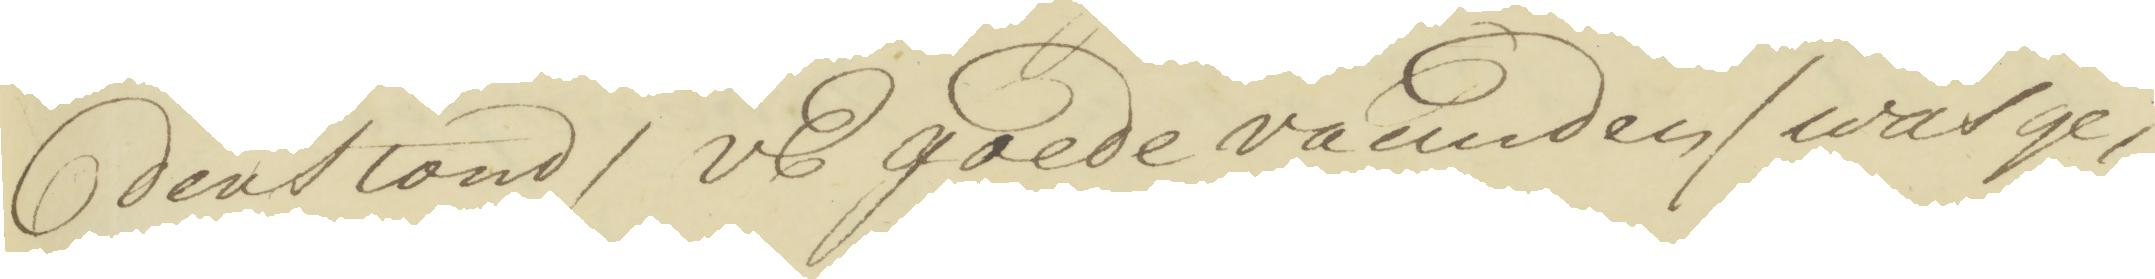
derstond/ uE goede vrunden / was ge„
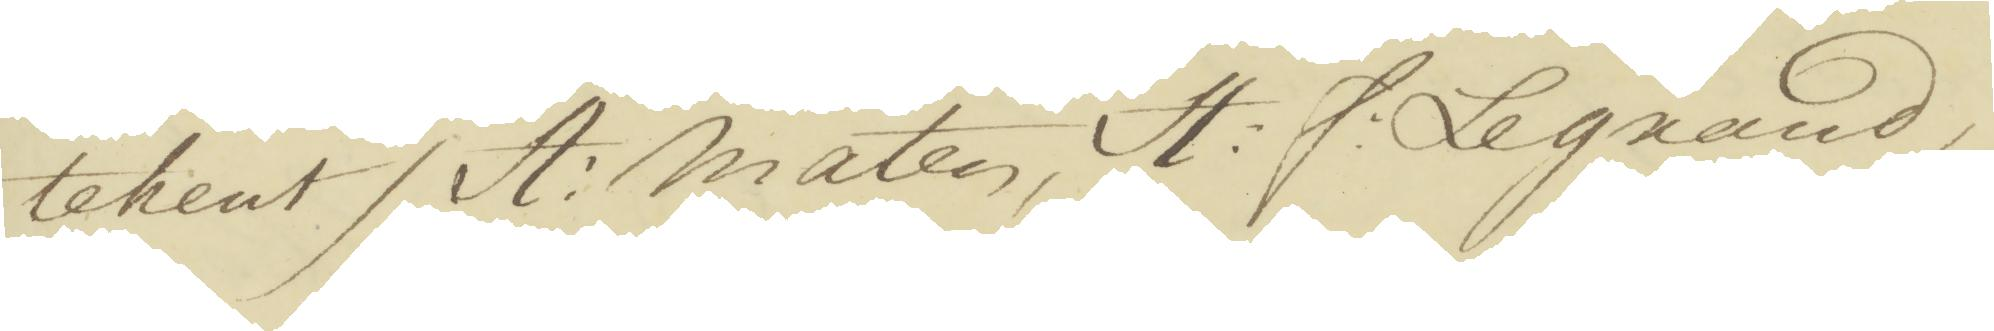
tekent / A: maten, H: f: Legrand,
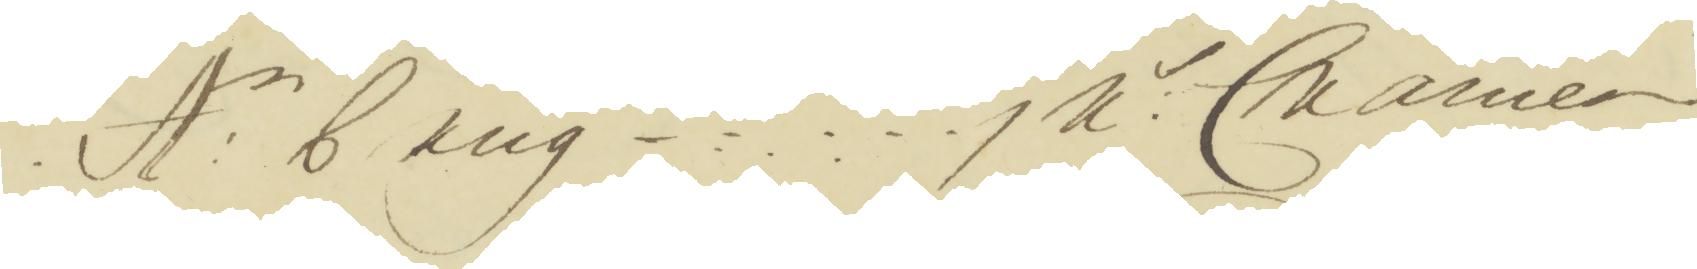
. A:n brug – - - - - , r:s Cramer
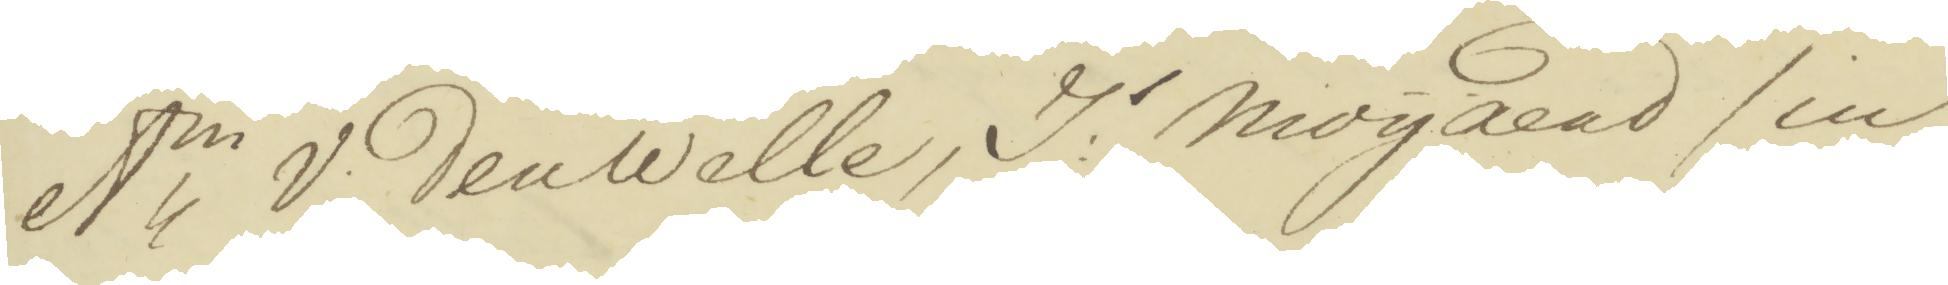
A„m v: den welle, I:s moijaerd / in
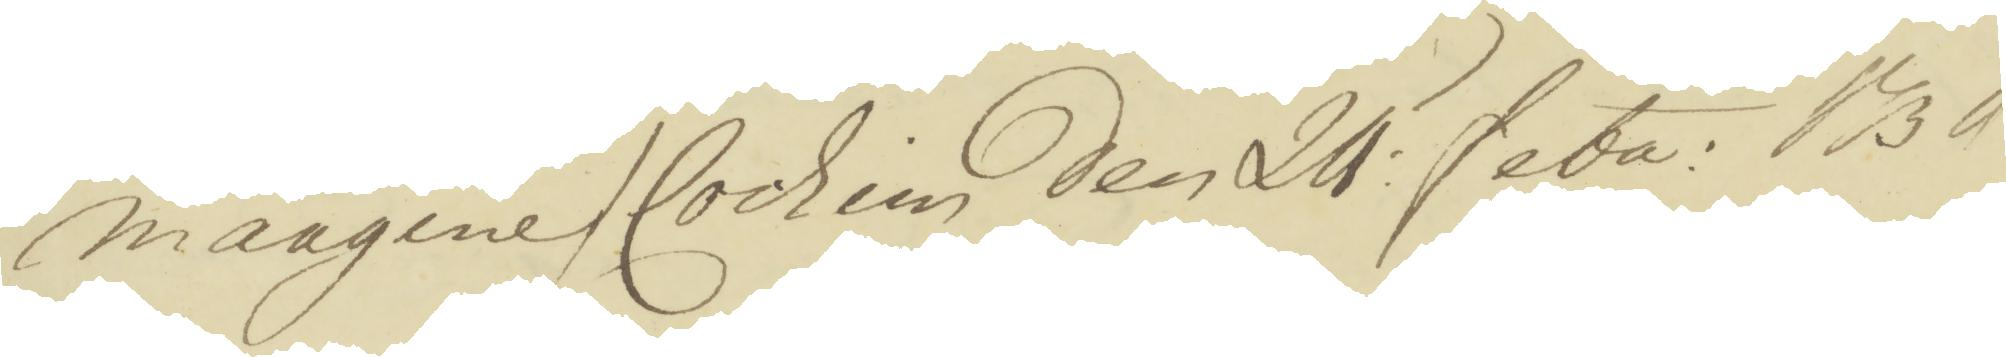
margine/ Cochim den 24:' febr: 1734
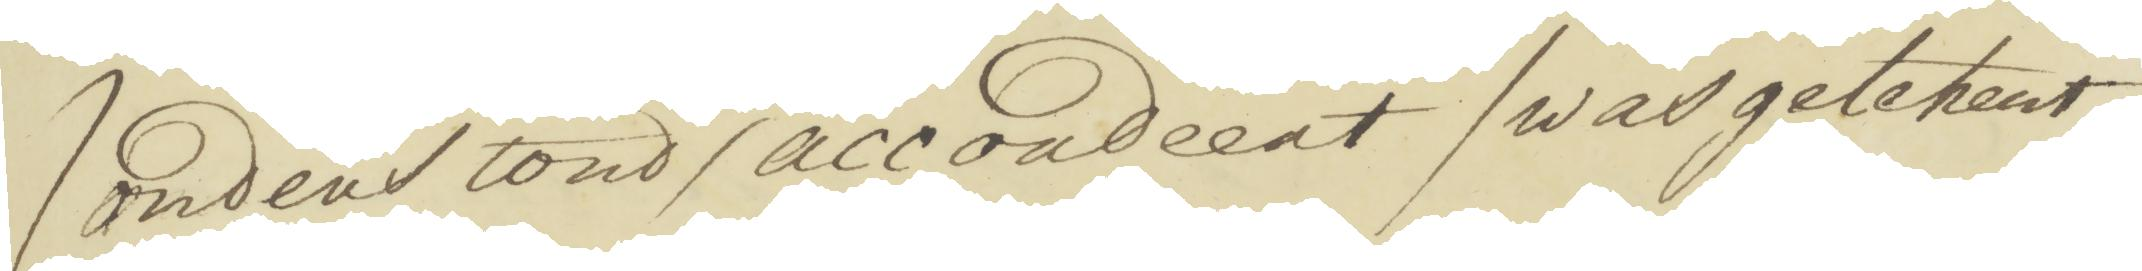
/ onderstond / accordeert / was getekent
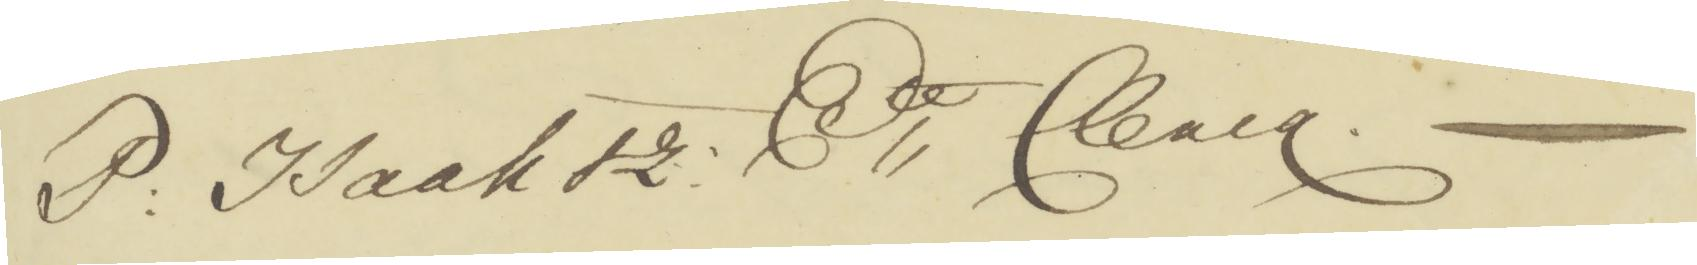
P: Isaaksz: E„le Clercq.
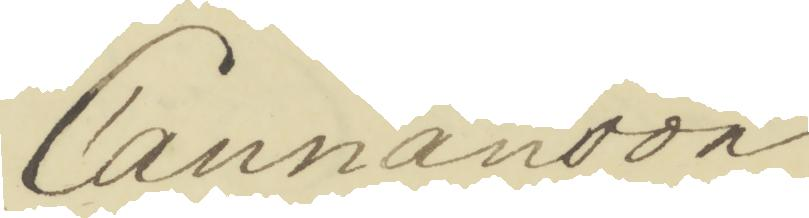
Cannanoor
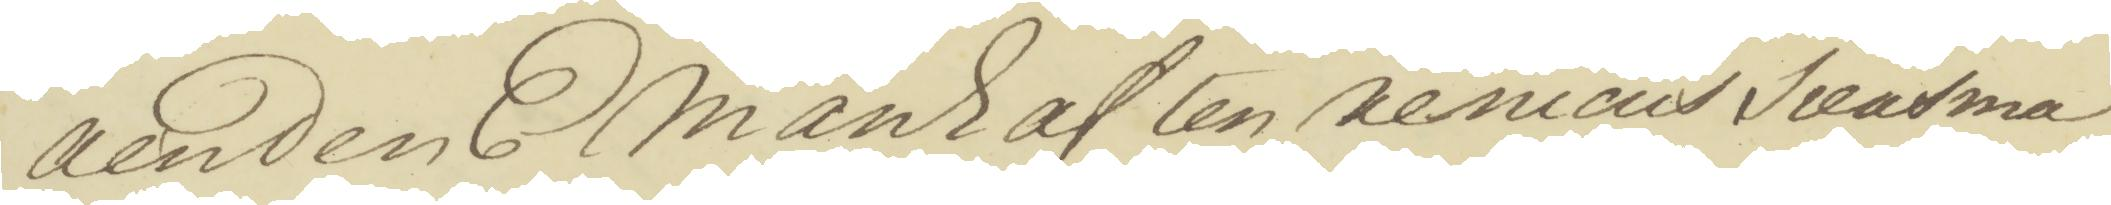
aen den E manhaften renicus Siersma
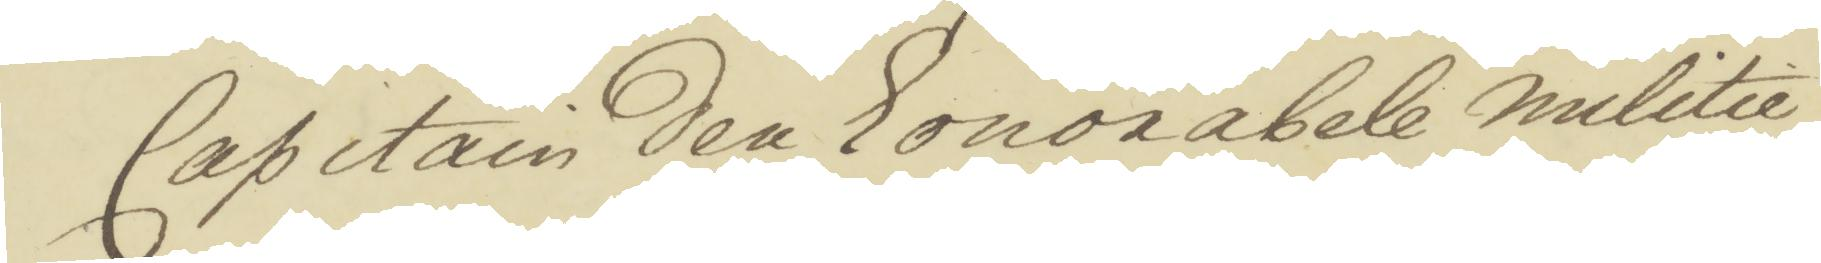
Capitain der honorabele militie
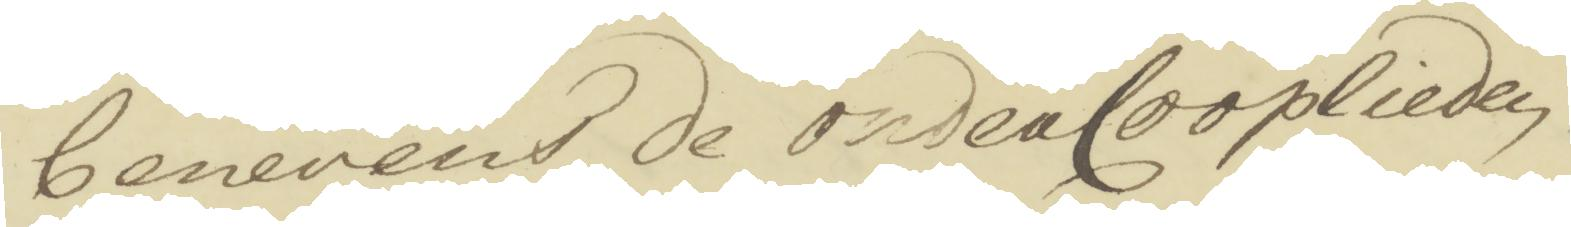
benevens de ondercooplieden
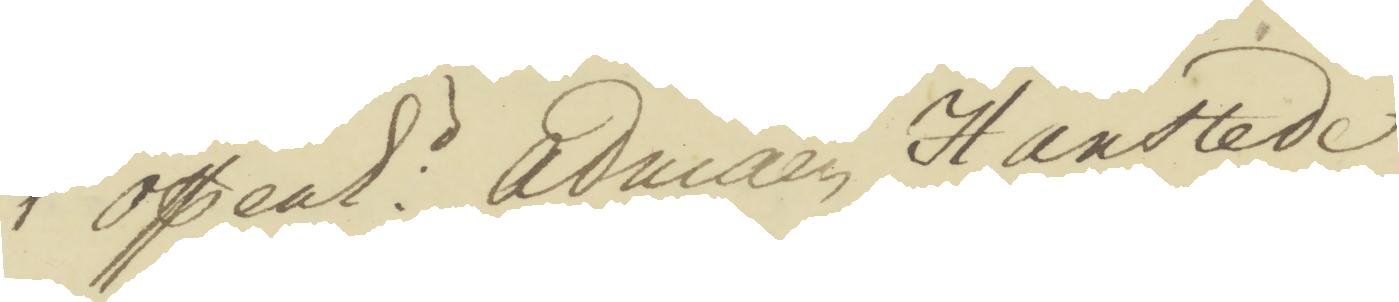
't opperh:d adrian Harstede
